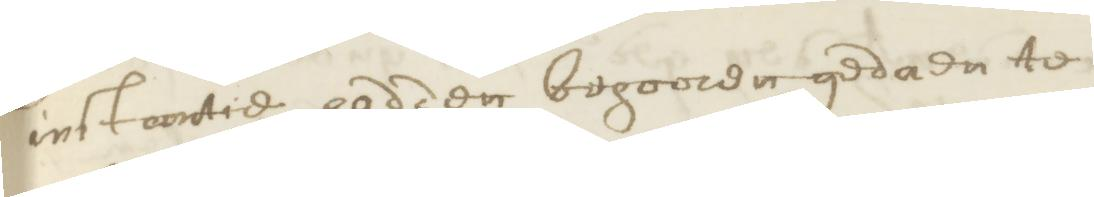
instantie hadden behooren gedaen te
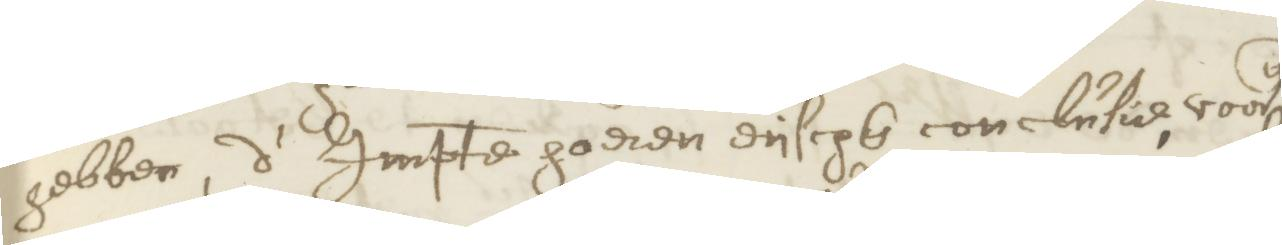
hebben, d’ Impte haeren eijsch ende conclusie, voor
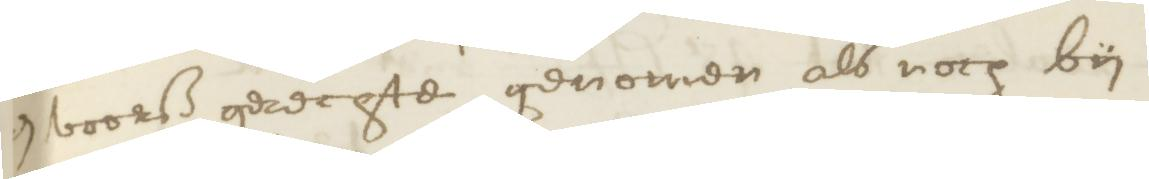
ende voorsz gezechte genomen als noch bij
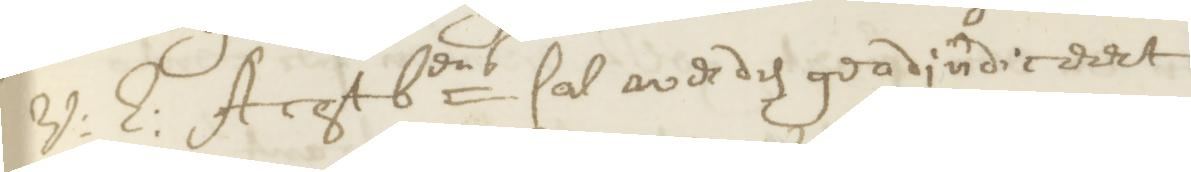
V: E: Achtb=ens sal over den geadjudiceert
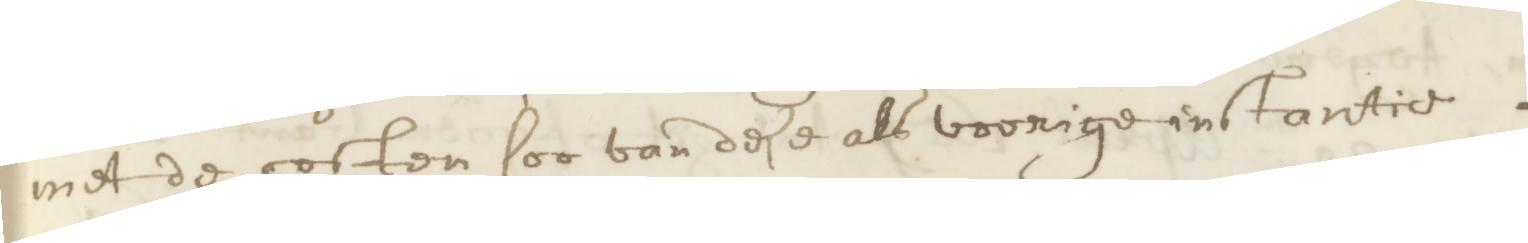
met de costen soo van dese als voorige instantie
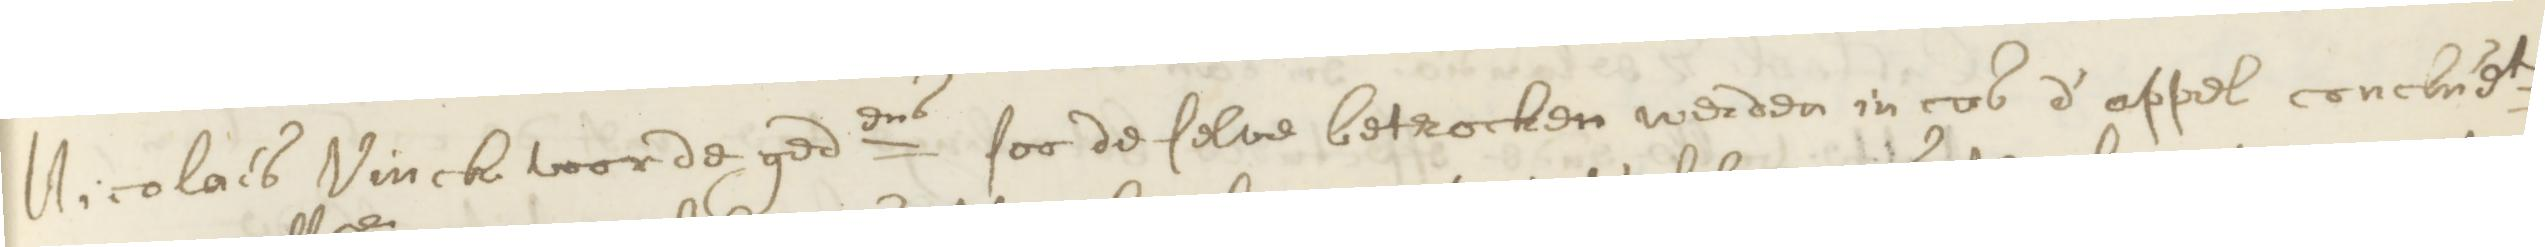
Nicolaes Vinck voorde ged=ens soo de selve betrocken werden in cas d’ appel conclud=t
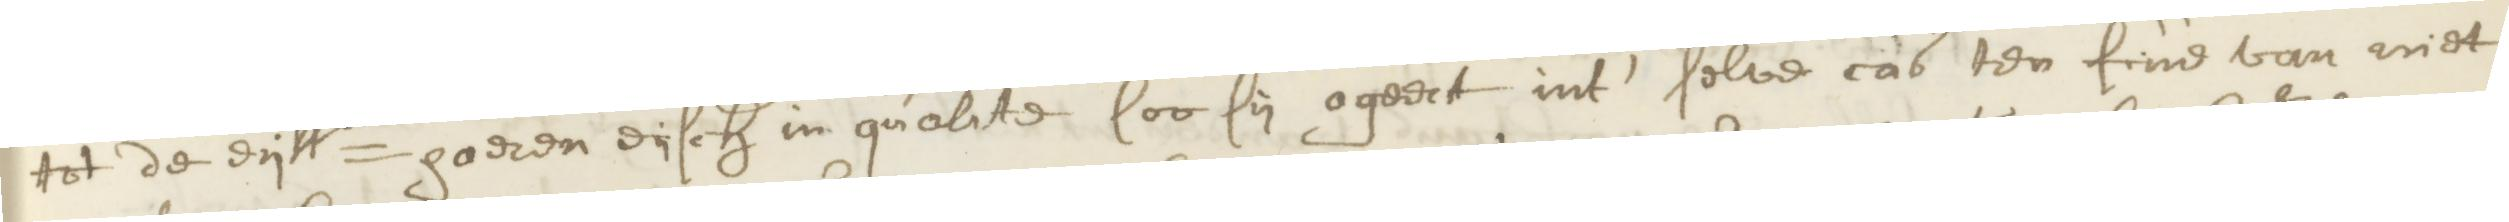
tot de eijss=ce haeren eijsch in qualite soo sij ageert int' selve cas ten fine van niet
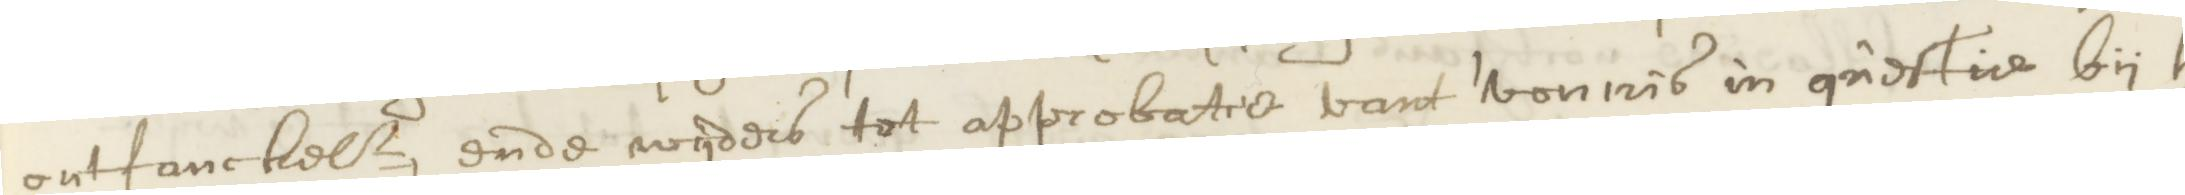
ontfanckelijk, ende wijders tot approbatie vant' vonnis in questie bij h=ren
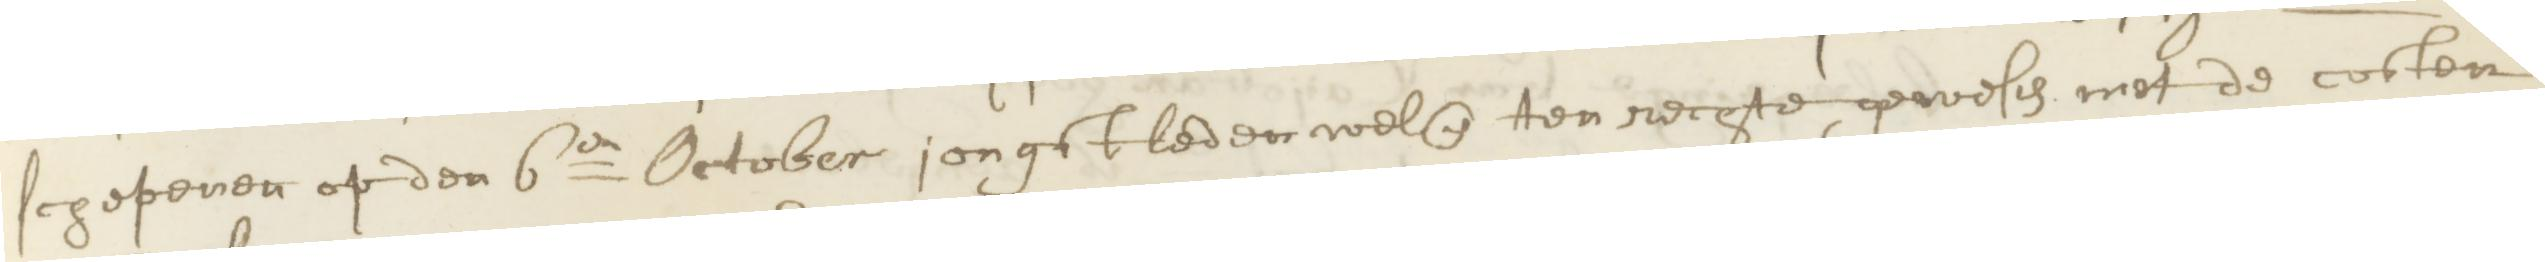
schepenen op den 6=en October jongstleden wel ende ten rechte gewesen met de costen
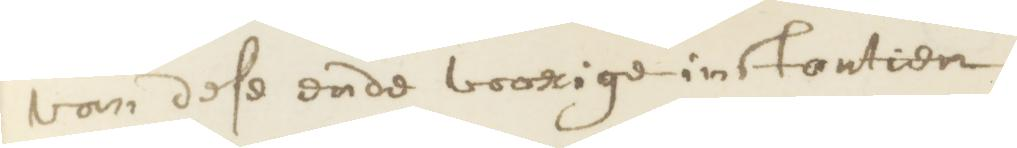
van dese ende voorige instantien
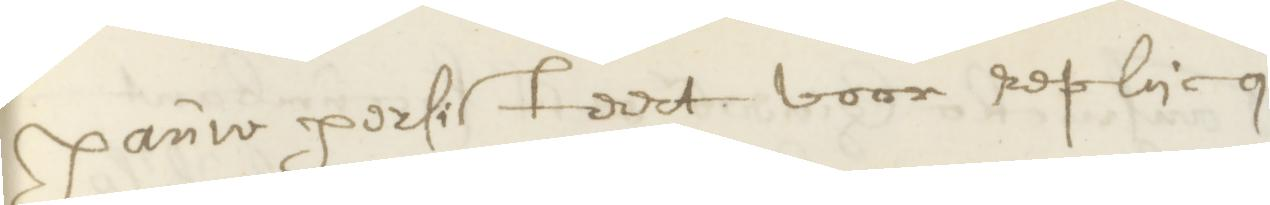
panie persisteert voor replijcq
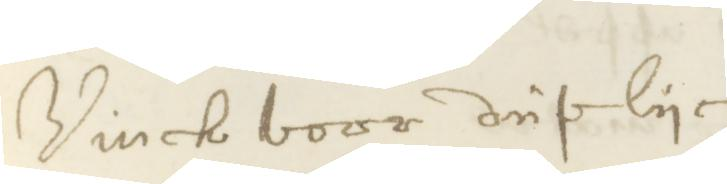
Vinck voor duplijcq
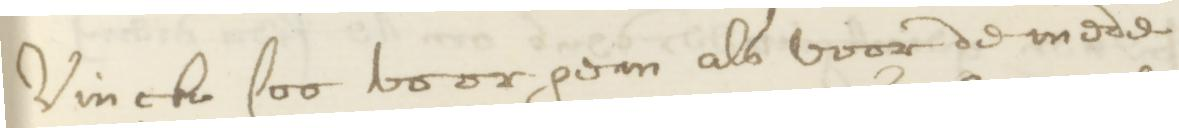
Vinck soo voor hem als voor de mede
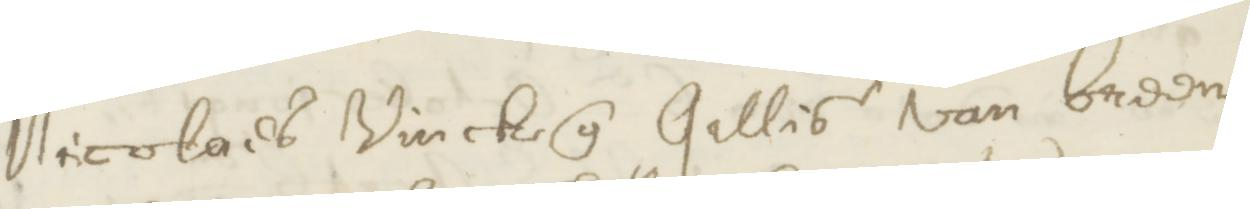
Nicolaes Vinck ende Gillis van breen
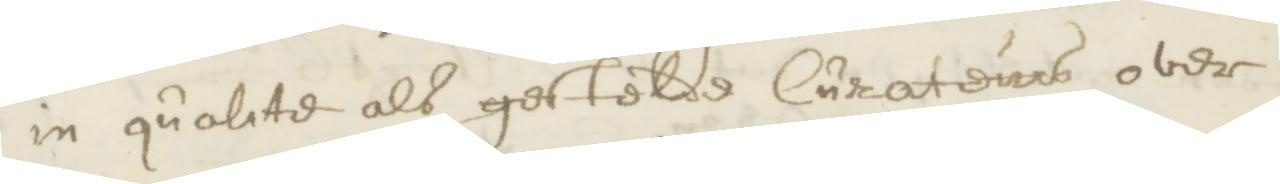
in qualite als gestelde Curateurs over
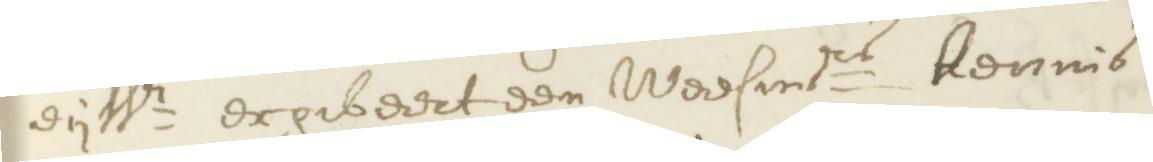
eijss=r exhibeert een Weesm=rs kennis
